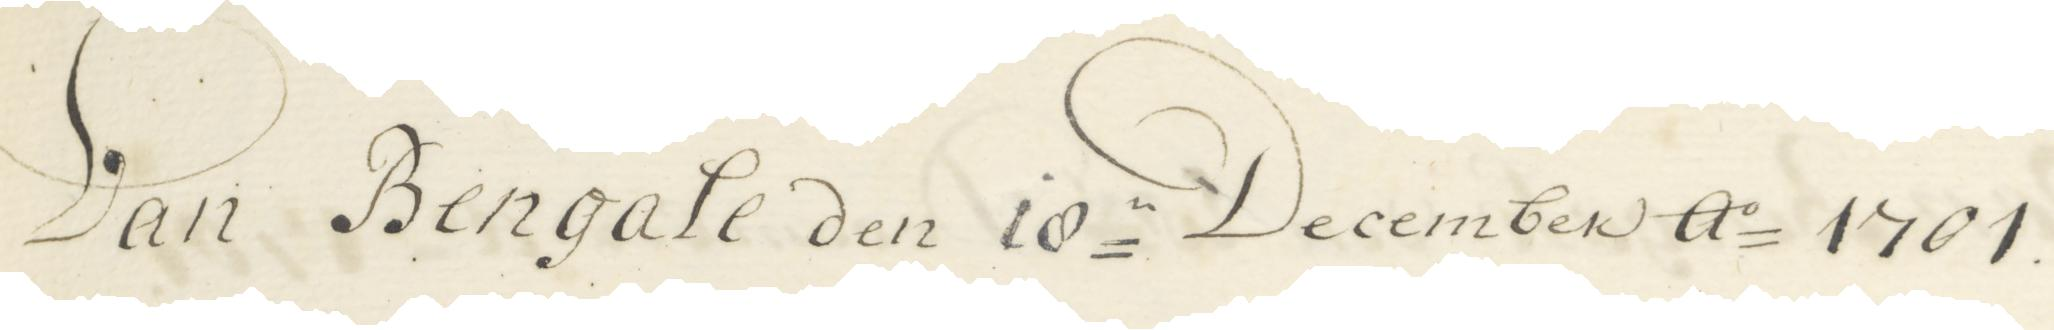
Van Bengale den 18=n December A=o 1701.
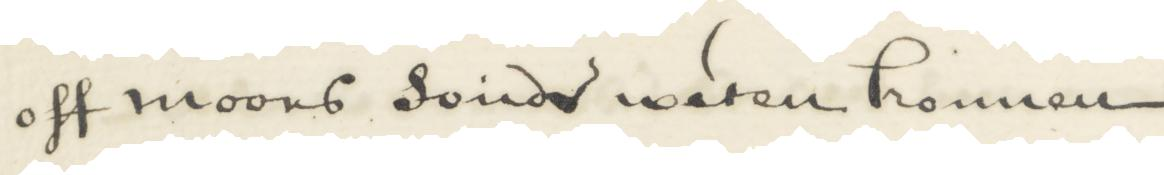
off moors soude weten konnen
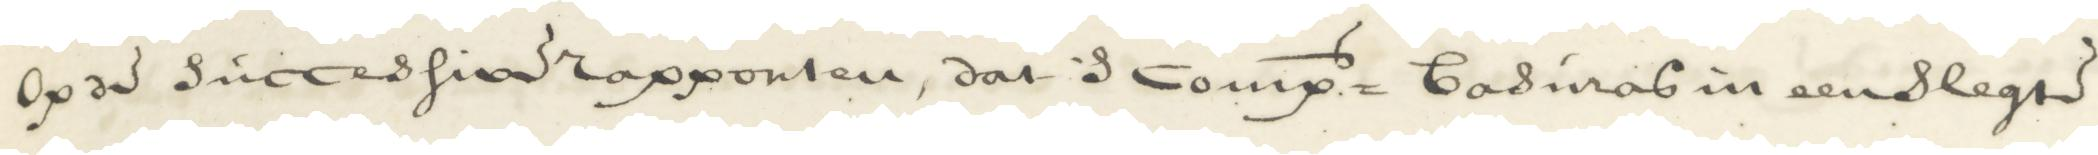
Op de successive rapporten, dat ’s Comp=s basuras in een slegte
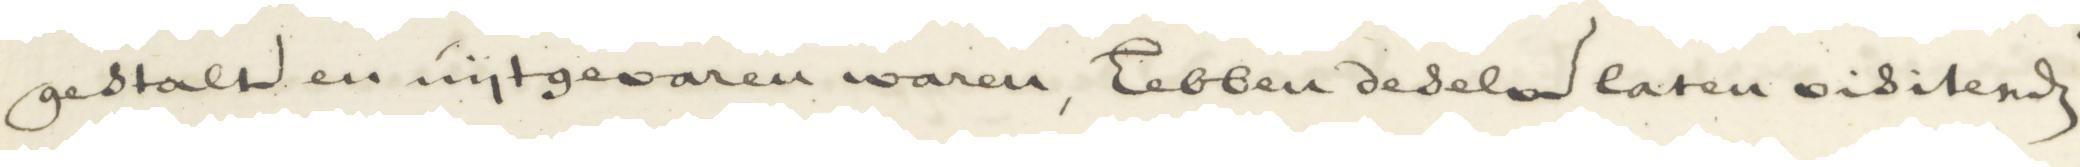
gestalte en uijtgevaren waren, hebben deselve laten visiteren
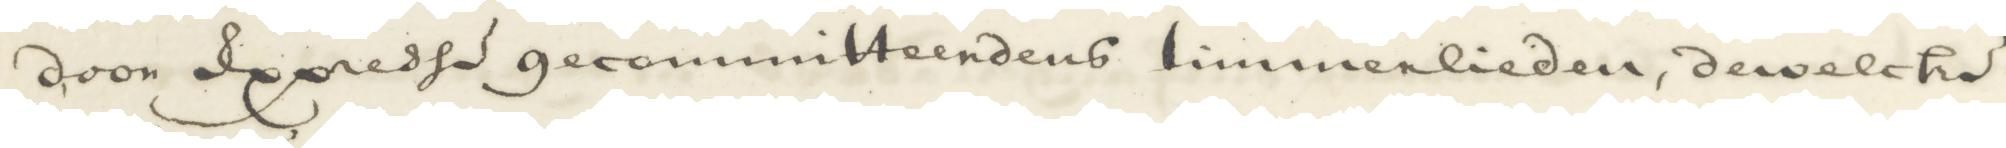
door Expresse gecommitteerdens timmerlieden, dewelcke
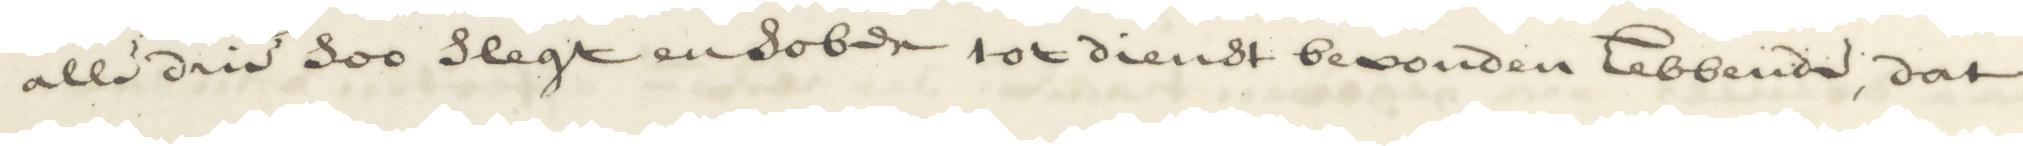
alle drie soo slegt en sober tot dienst bevonden hebbende, dat
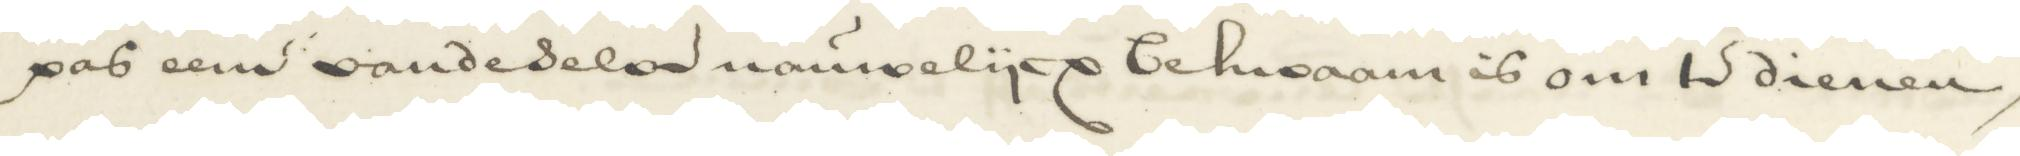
pas eene van deselve nauwelijcx bekwaam is om te dienen,
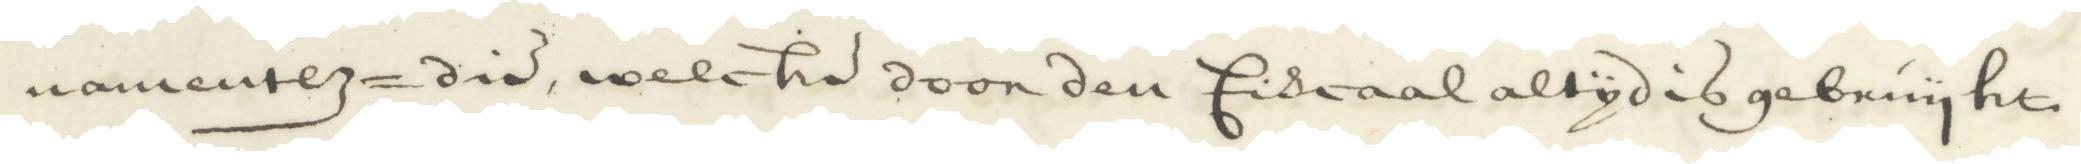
namentlijk= die, welcke door den fiscaal altijd is gebruijkt.
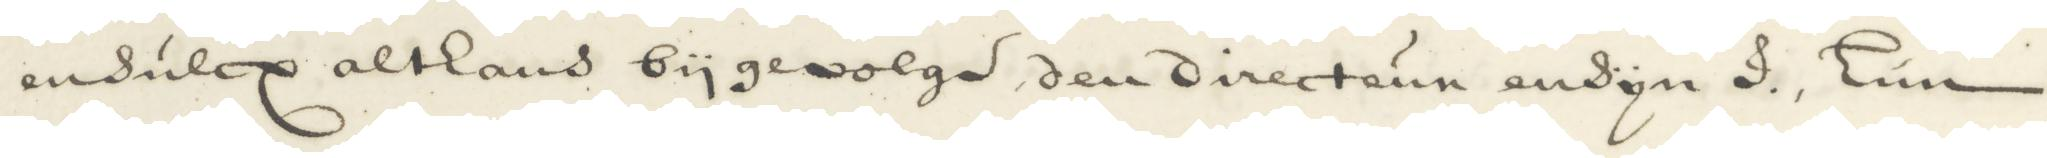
en sulcx althans bij gevolge, den directeur en sijn E., hun
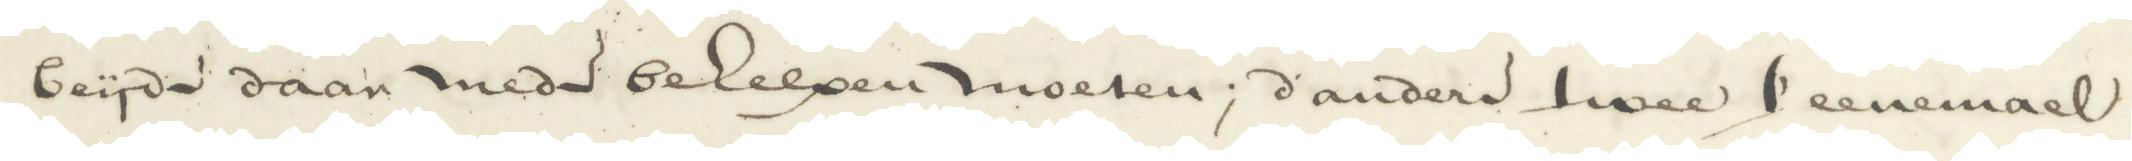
beijde daar mede behelpen moeten; d’ andere twee t'eenemael
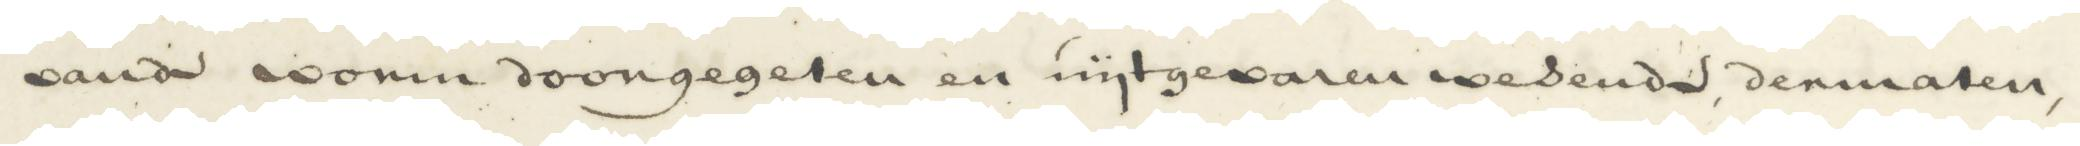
vande worm doorgegeten en uijtgevaren wesende, dermaten,
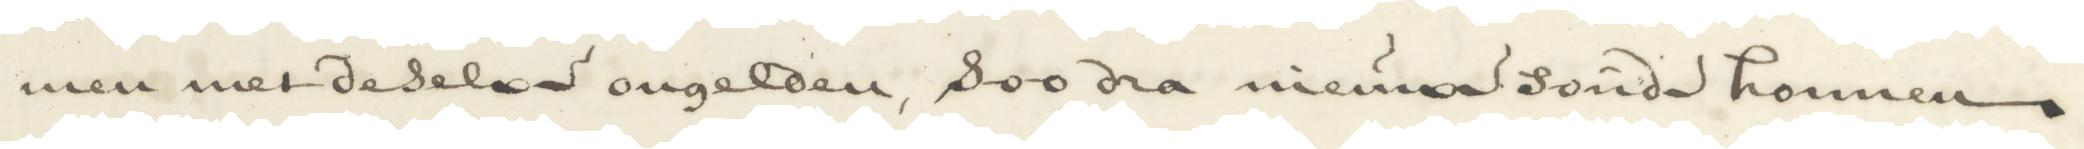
men met deselve ongelden, soo dra nieuwe soude konnen
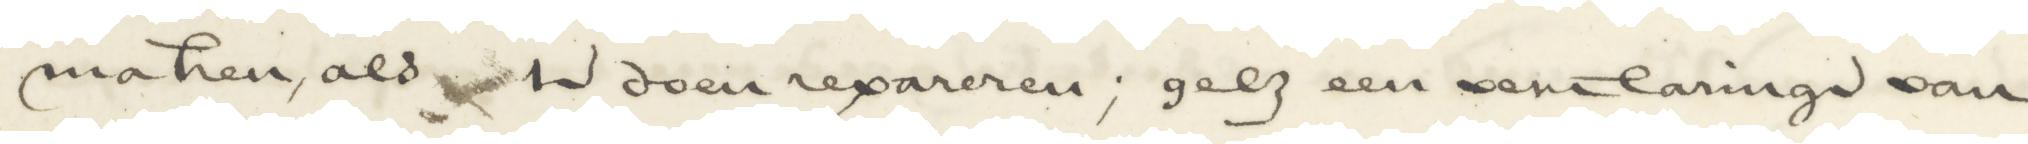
maken, als te doen repareren; gelijk een verclaringe van
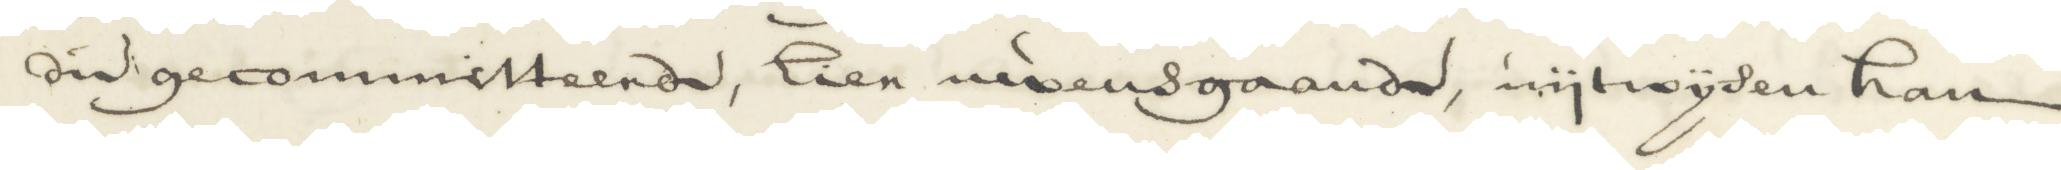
die gecommitteerde, hier nevensgaande, uijt wijsen kan
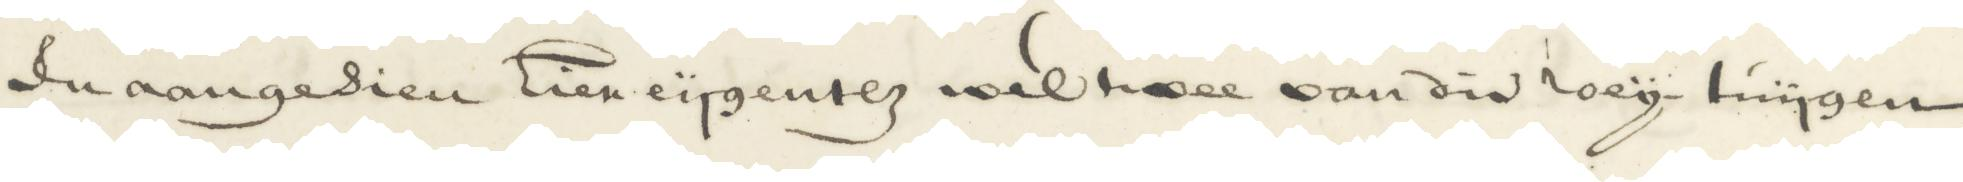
En aangesien hier eijgentlijk wel twee van die roeij-tuijgen
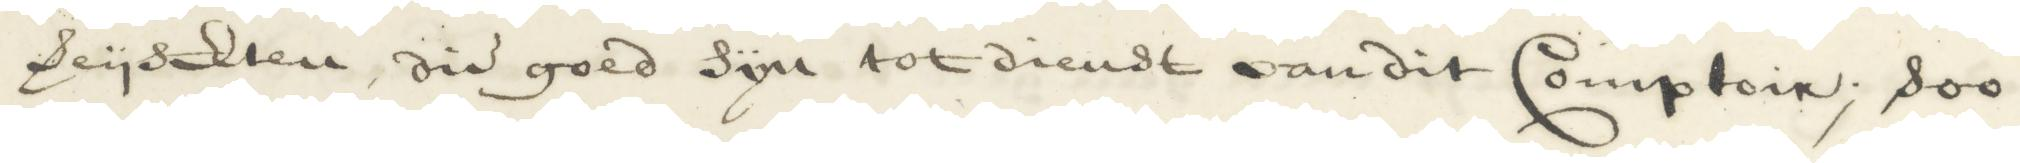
vereijschten, die goed sijn tot dienst van dit Comptoir; soo
